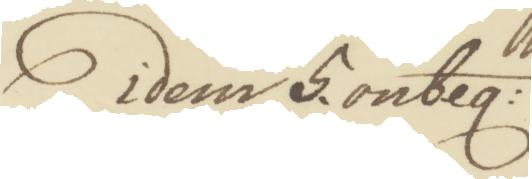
idem 5 onbeq:
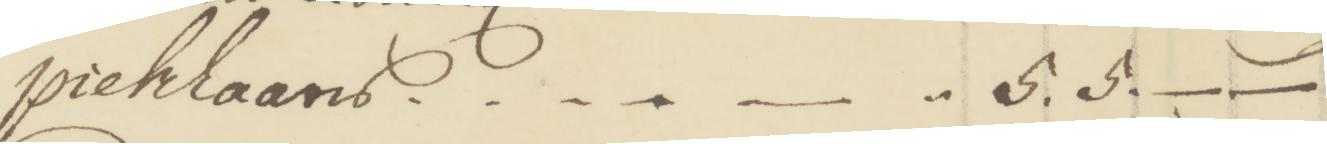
piekhaans - - - - - - - 5. 5. — —
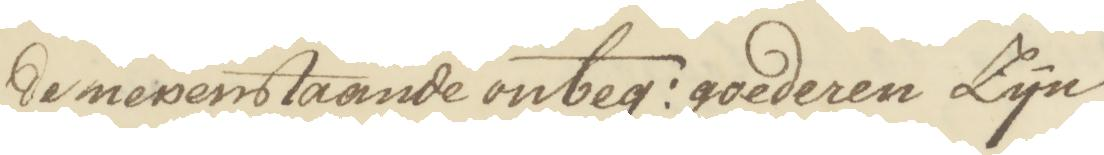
de nevenstaande onbeq: goederen zijn
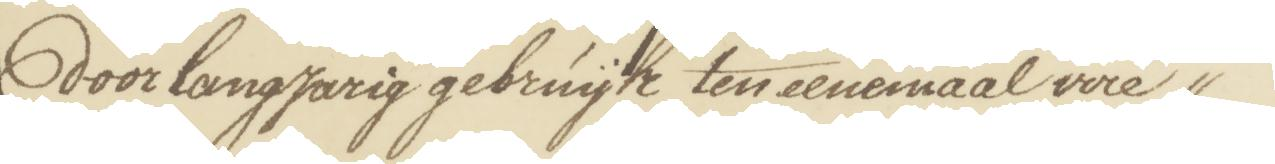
door langjarig gebruijk ten eenemaal irre„
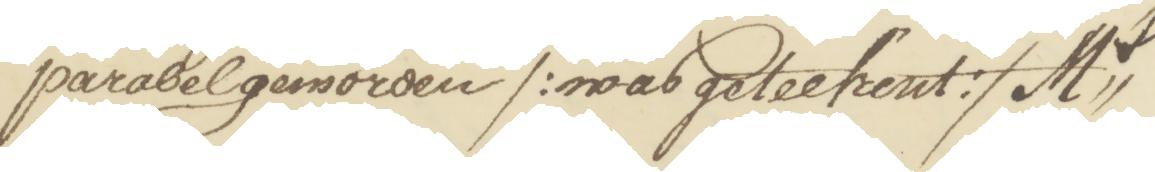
parabel geworden /:was geteekent :/ M„s
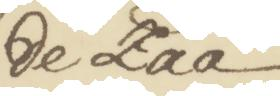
de Zaa
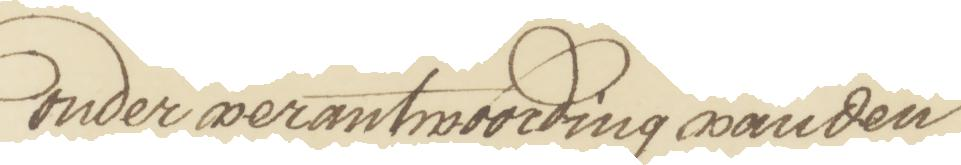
onder verantwoording vanden
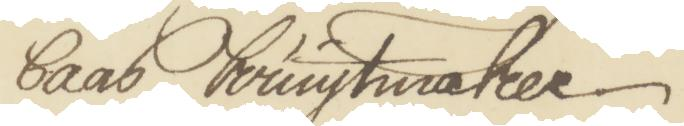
baas kruijtmaker
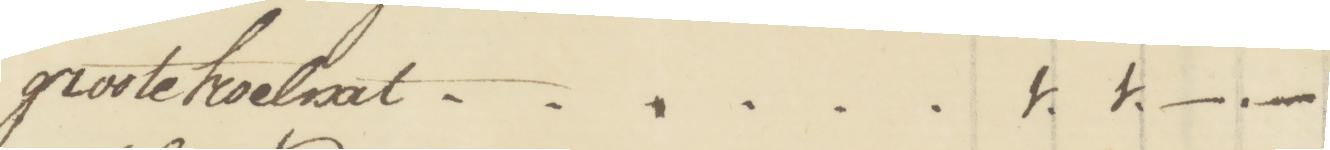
groote koelvat - - - - - - 1. 1. — . —
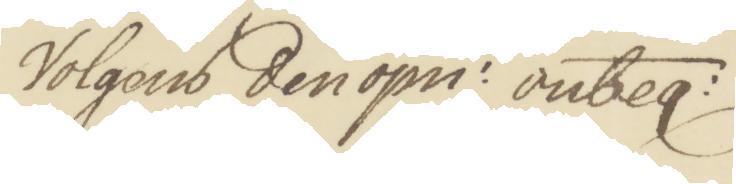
Volgens den opn: onbeq:
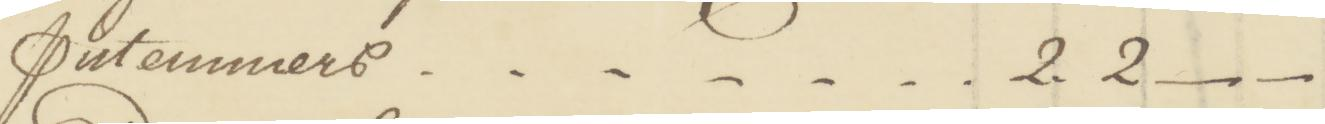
Putemmers - - - - - - - 2. 2 — —
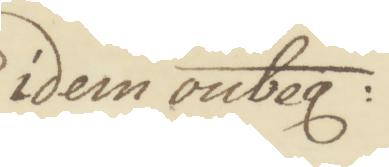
idem onbeq:
